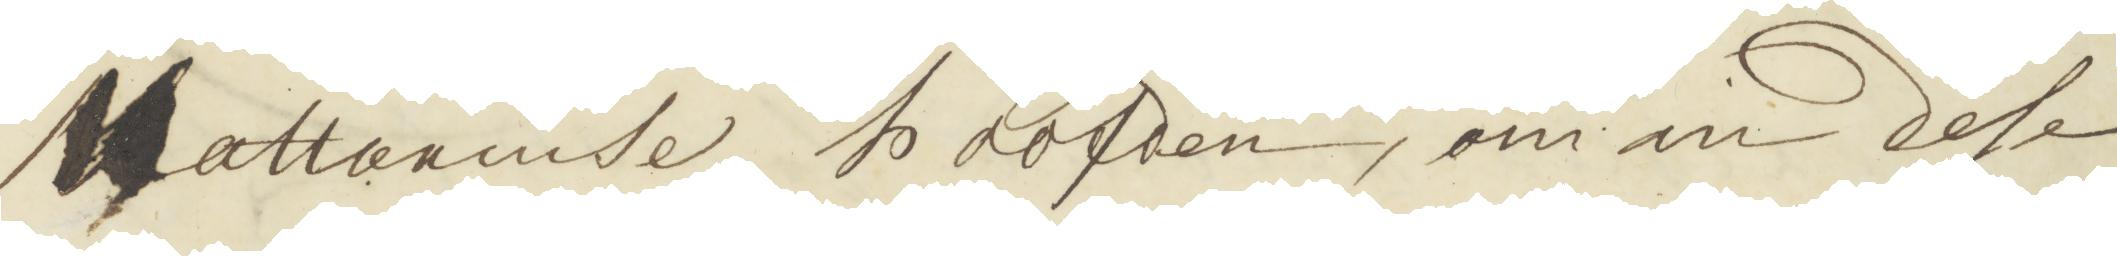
Mattorinse hoofden, om in dese
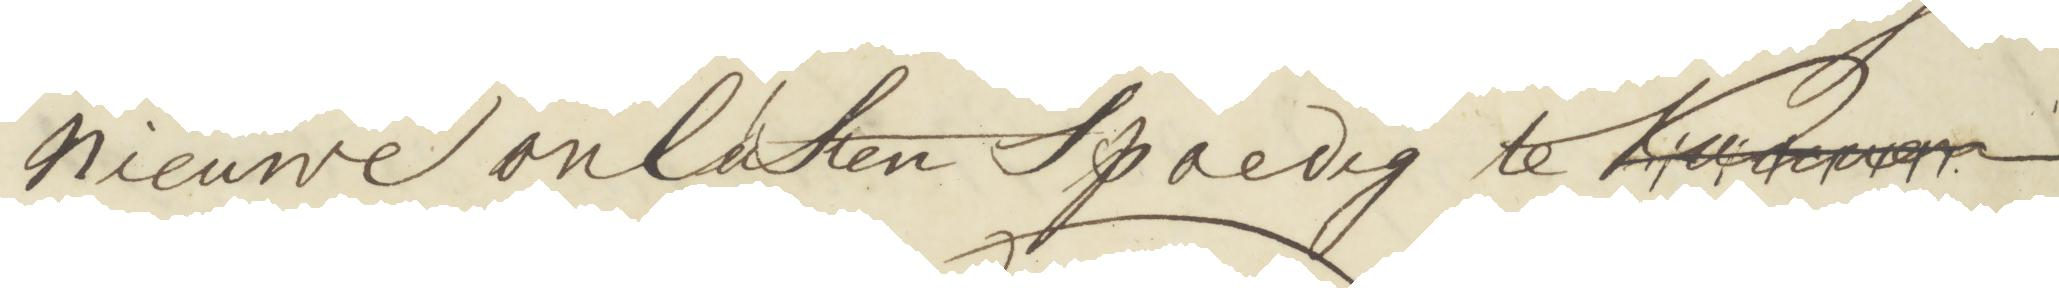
nieuwe onlusten spoedig te Ka
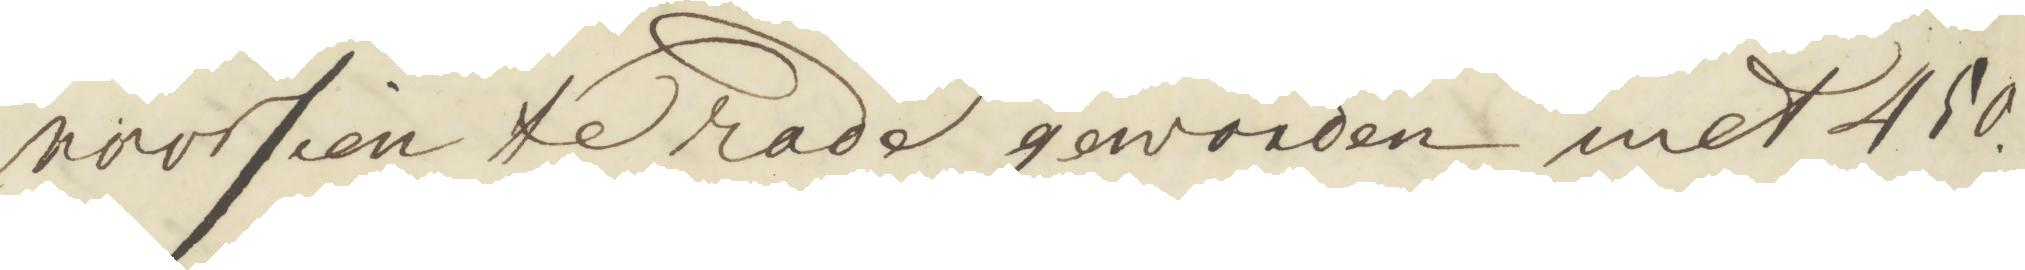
voorsien te rade geworden met 450.
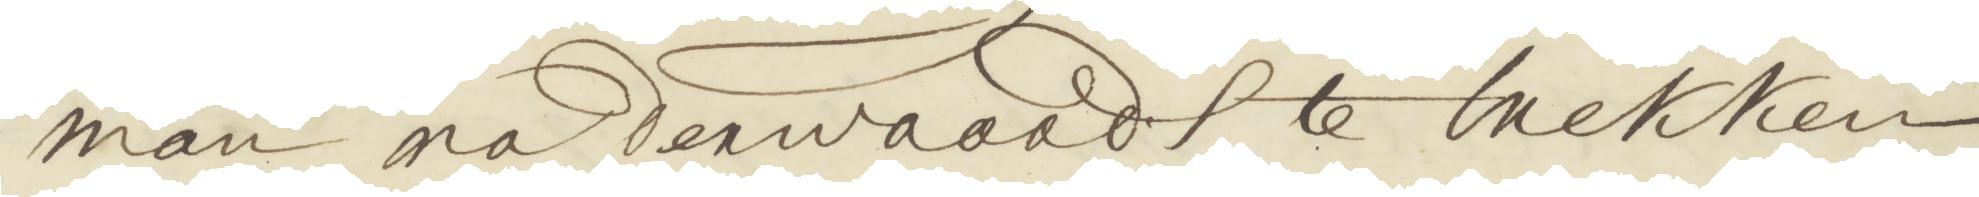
man na derwaards te trekken
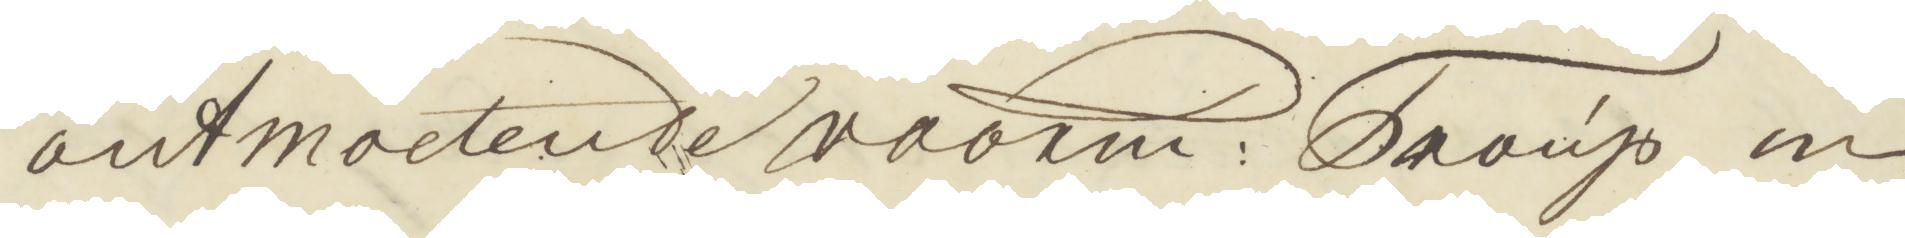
ontmoetende voorm: Troup in
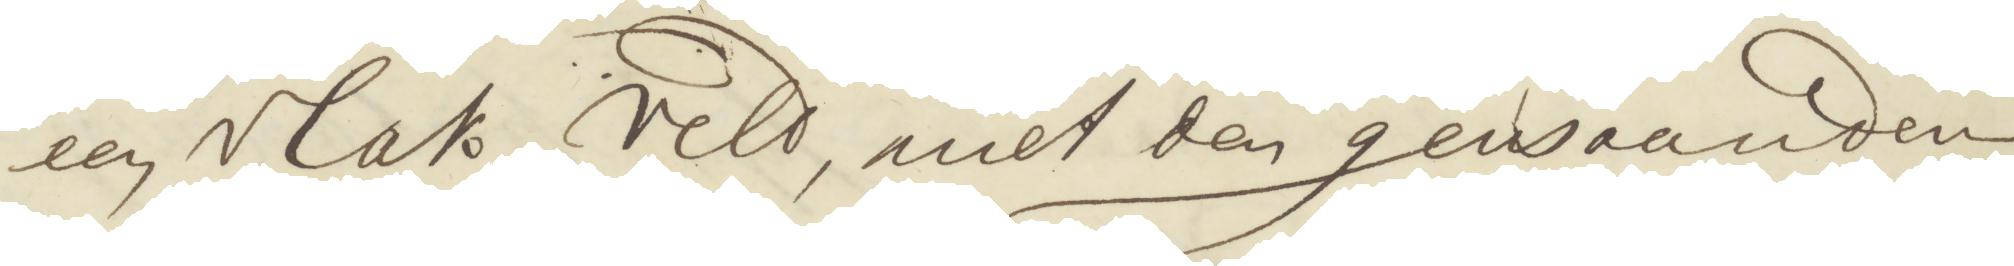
een vlak_veld, met den gewaanden
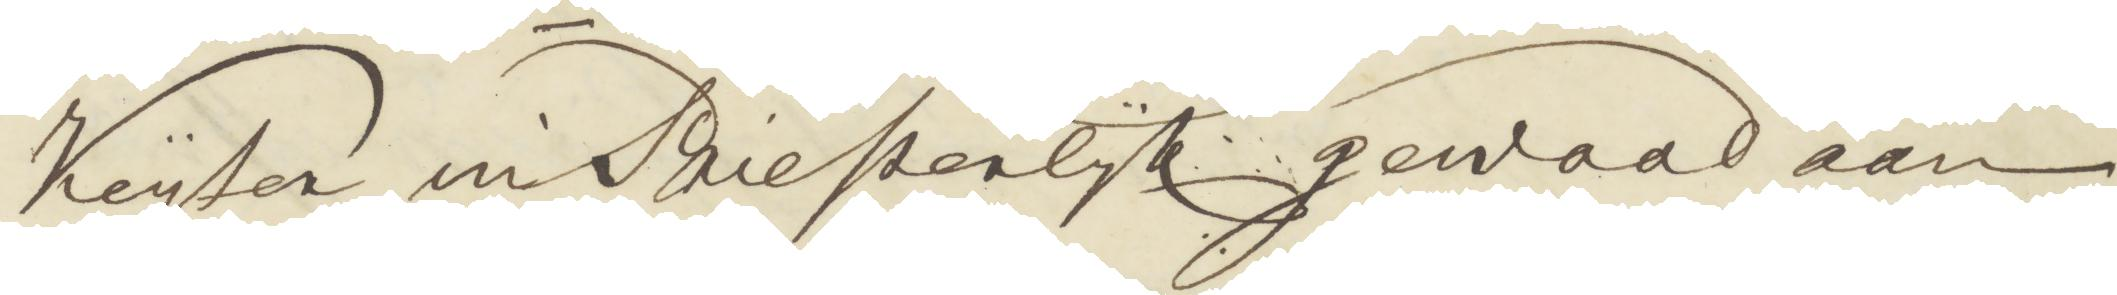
Keijser in priesterlijk gewaad aan
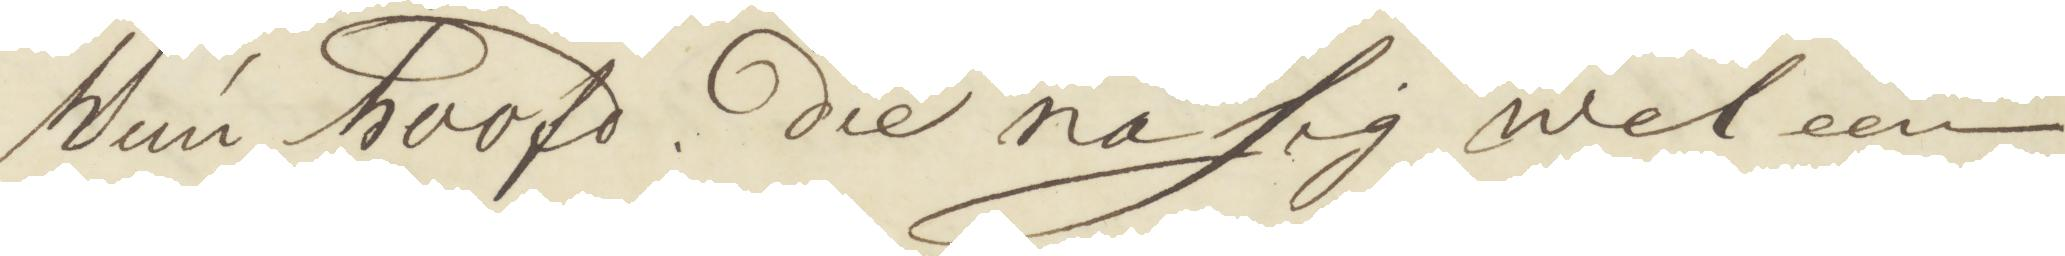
hun hoofd. die na sig wel een
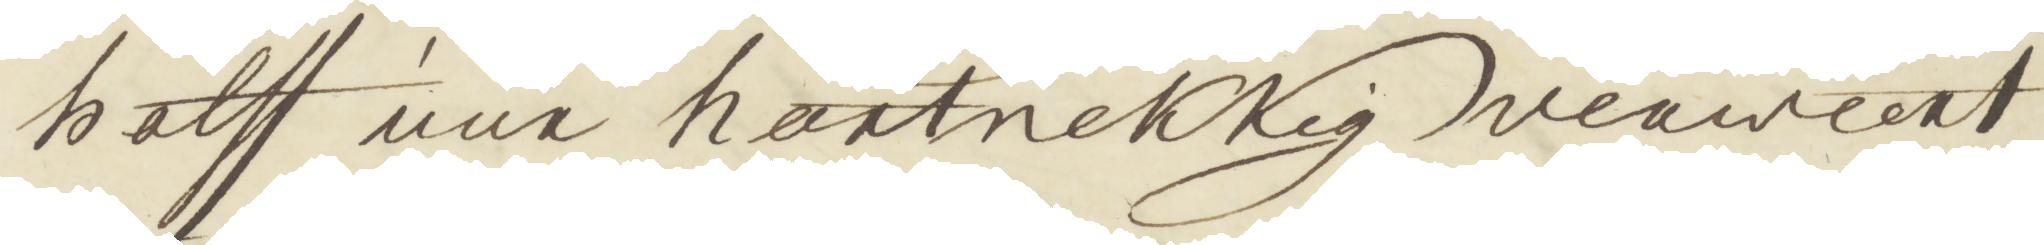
halff uur hartnekkig verweert
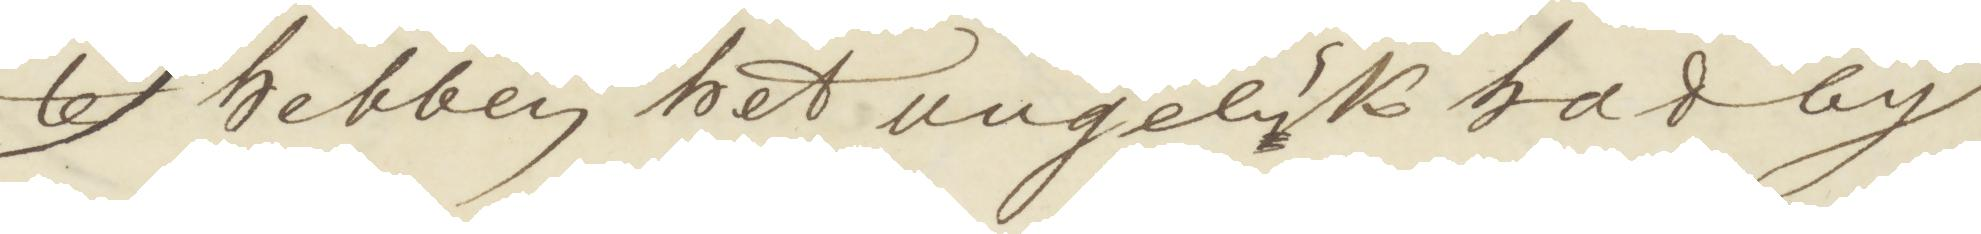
te hebben het ongeluk had bij
